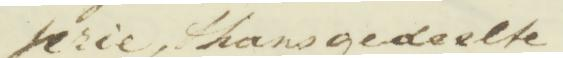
jerie, thans gedeelte
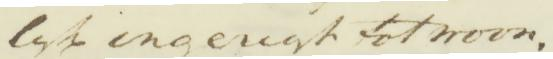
lyk ingerigt tot woon,
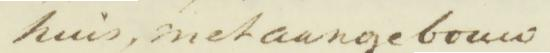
huis, met aangebouw
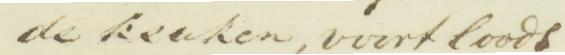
de keuken, voort loods
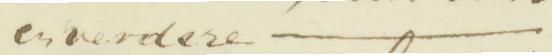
en verdere —
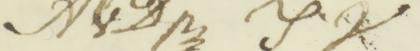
AVDj=r J V
